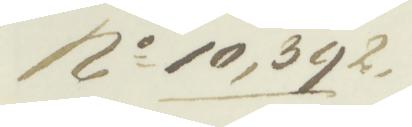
N=o 10,392.
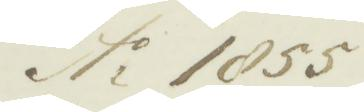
A:o 1855
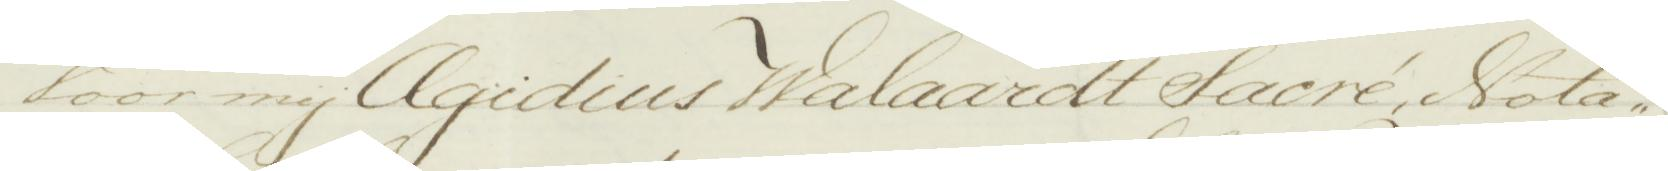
Voor mij Agidius Walaardt Sacré, Nota„
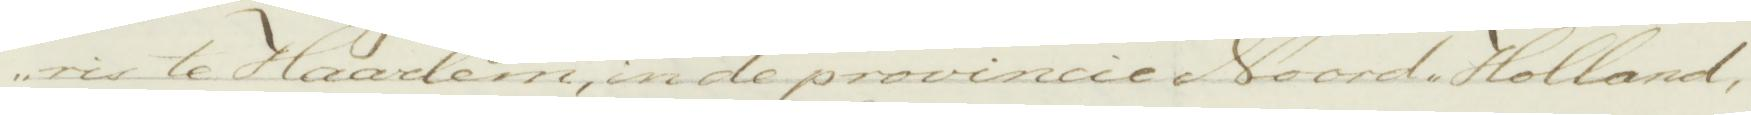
„ris te Haarlem, in de provincie Noord„ Holland,
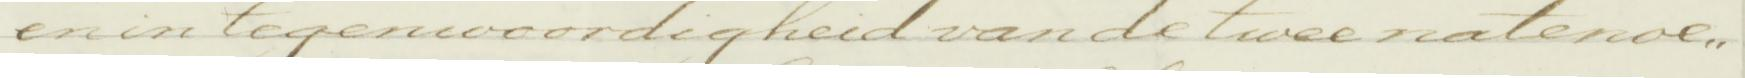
en in tegenwoordigheid van de twee na te noe„
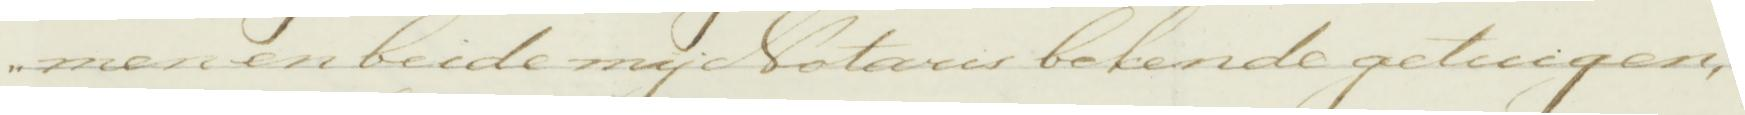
„men en beide mij Notaris bekende getuigen,
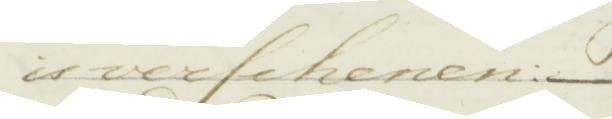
is verschenen: -
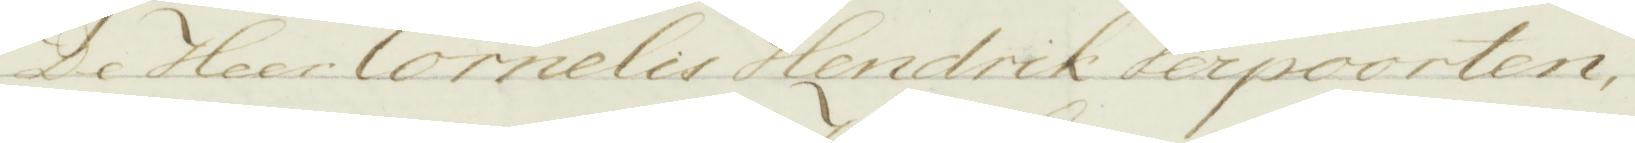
De Heer Cornelis Hendrik Verpoorten,
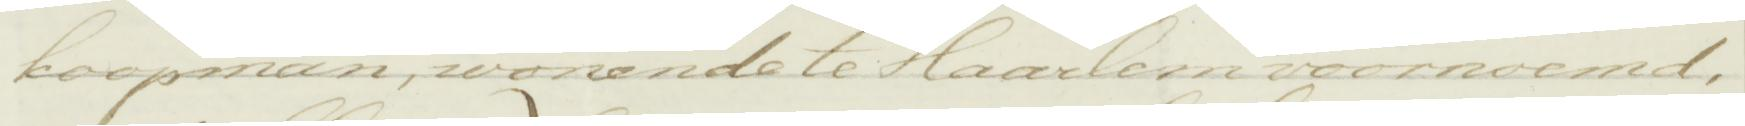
koopman, wonende te Haarlem voornoemd,
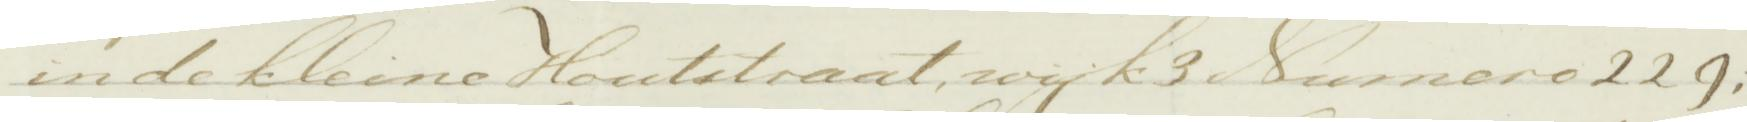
in de kleine Houtstraat, wijk 3 Numero 229;
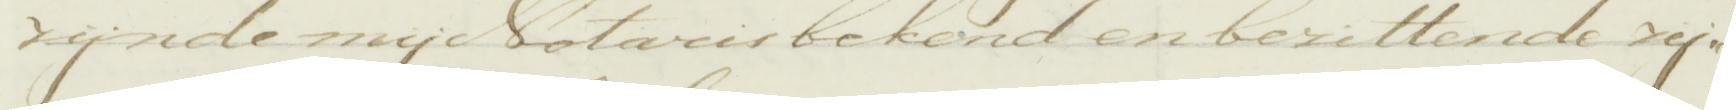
zijnde mij Notaris bekend en bezittende zij„
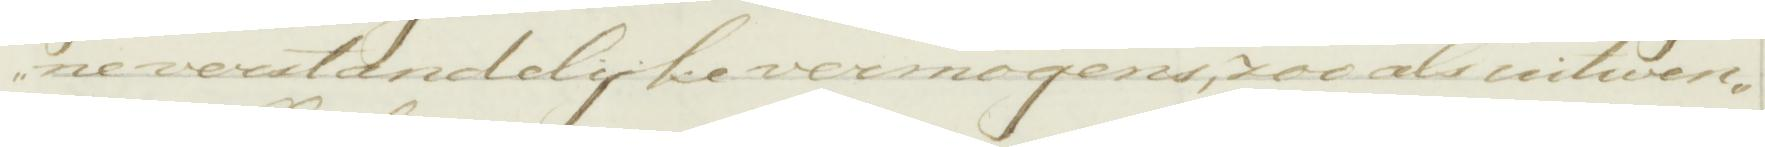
„ne verstandelijke vermogens, zoo als uitwen„
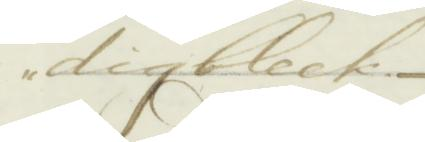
„dig bleek.-
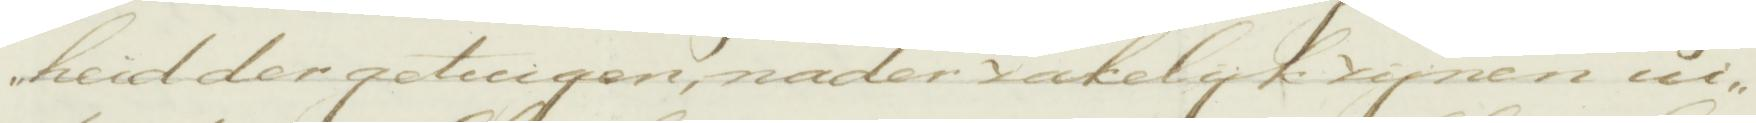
„heid der getuigen, nader zakelijk zijnen ui„
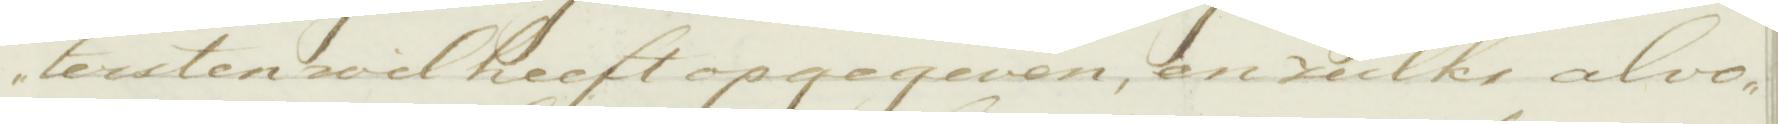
„tersten wil heeft opgegeven, en zulks alvo„
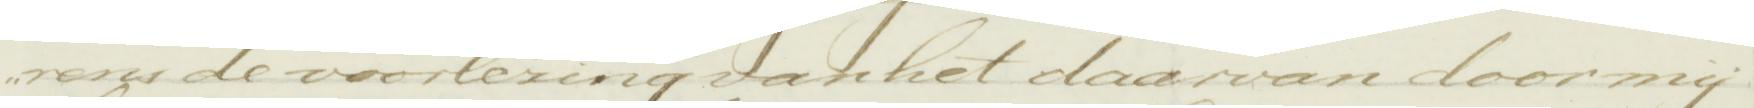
„rens de voorlezing van het daarvan door mij
